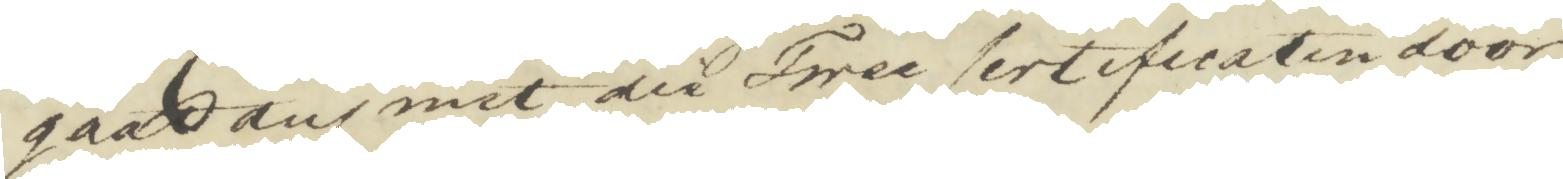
gaat dus met die Twee certificaten door
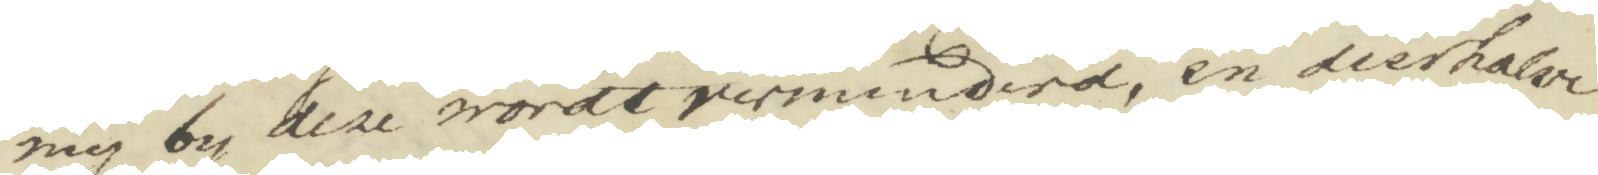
my by deze wordt verminderd, en dierhalve
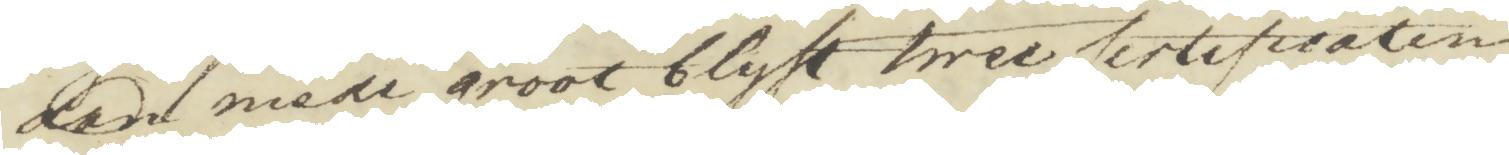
dan mede groot blyft twee certificaten
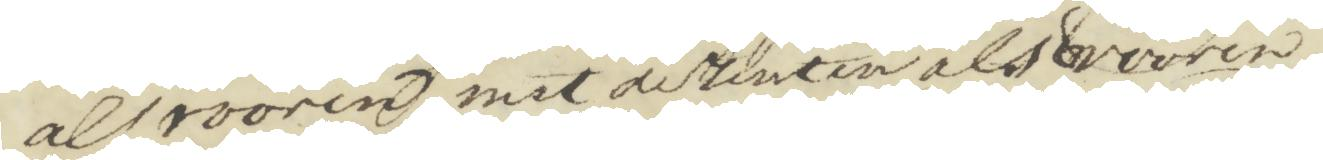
als vooren met de renten als vooren.
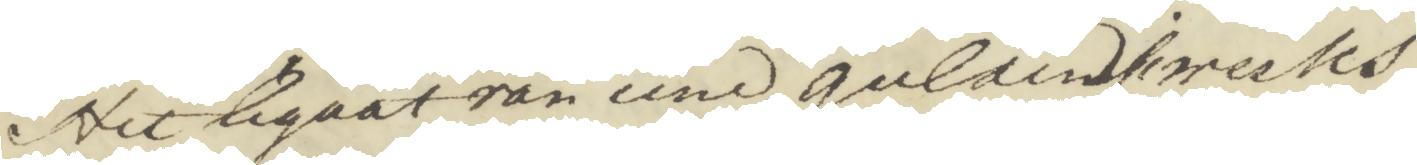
Het legaat van eene gulden s'weeks
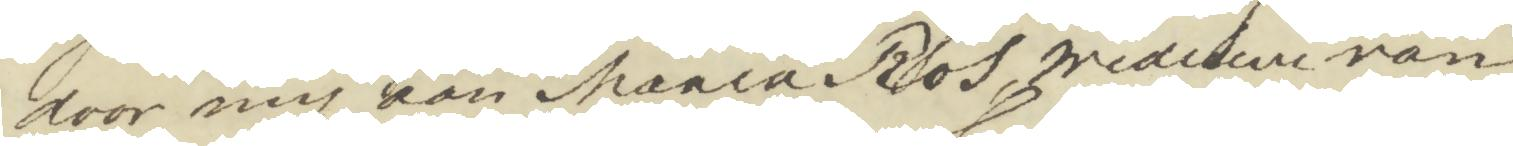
door my aan Maria Ros, weduwe van
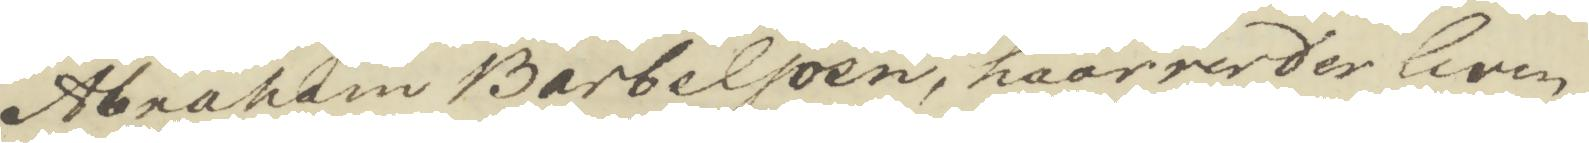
Abraham Barbeljoen, haar verder leven
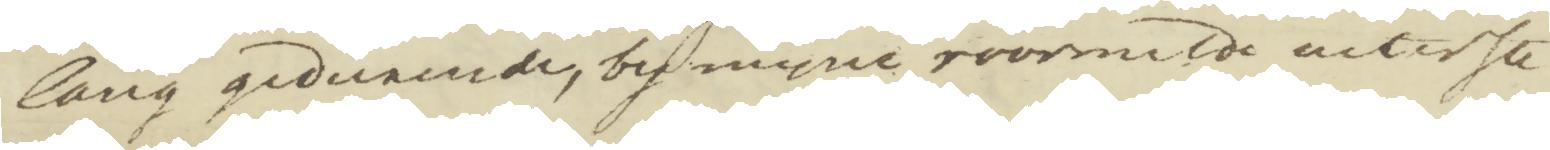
lang gedurende, by myne voormelde uiterste
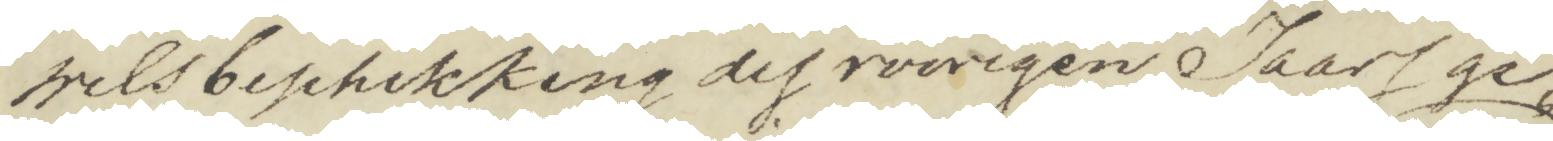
wils beschikking des voorigen Iaars ge
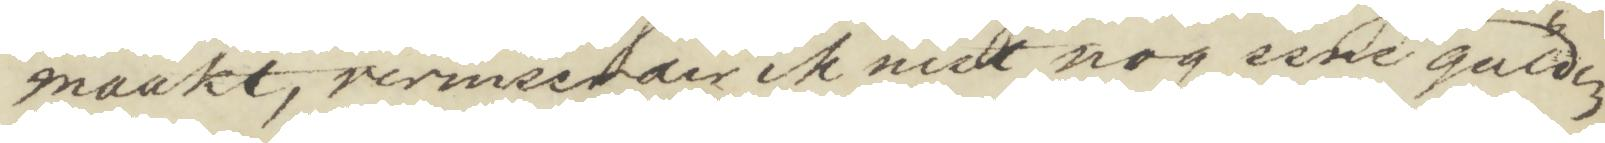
maakt, vermeerder ik met nog eene gulden
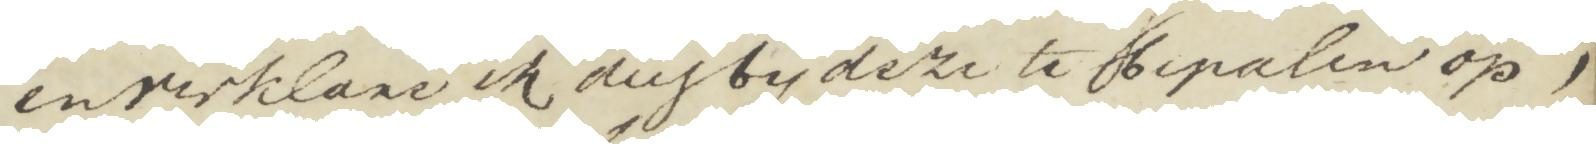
en verklare ik dus by deze te bepalen op
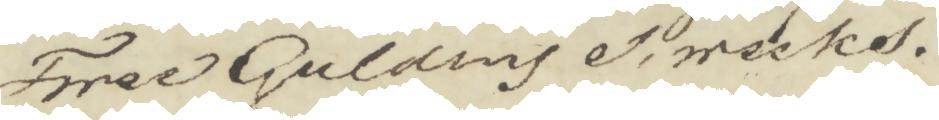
Twee Guldens s,weeks.
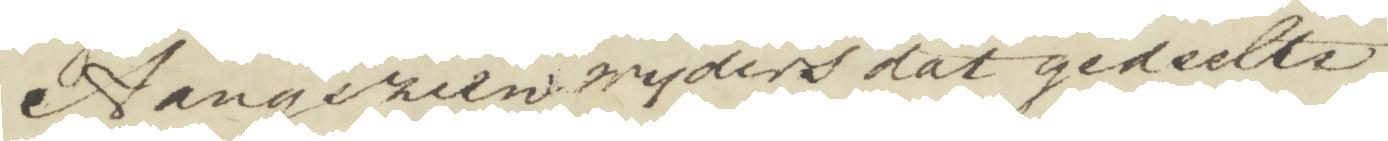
Aangezien wyders dat gedeelte
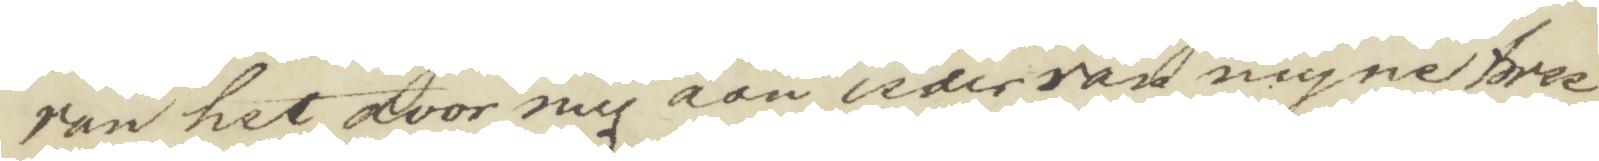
van het door my aan ieder van myne twee
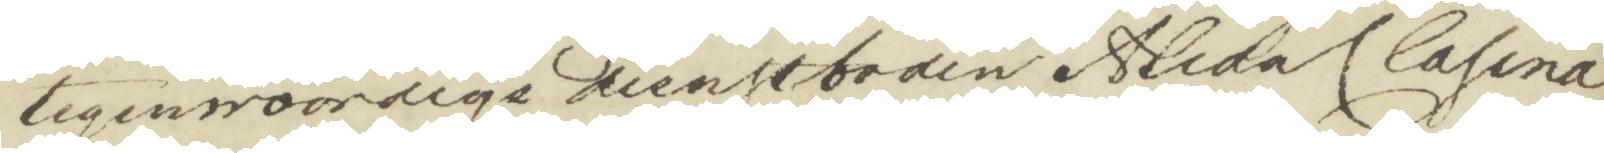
tegenwoordige dienstboden Alida Casina
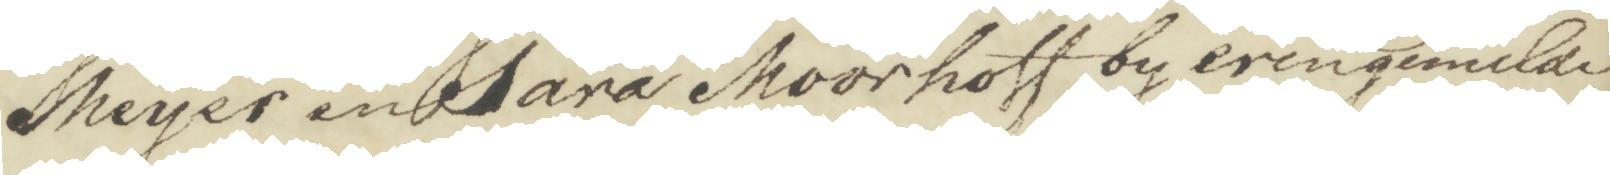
Meyer en Sara Moorhoff bij evengemelde
